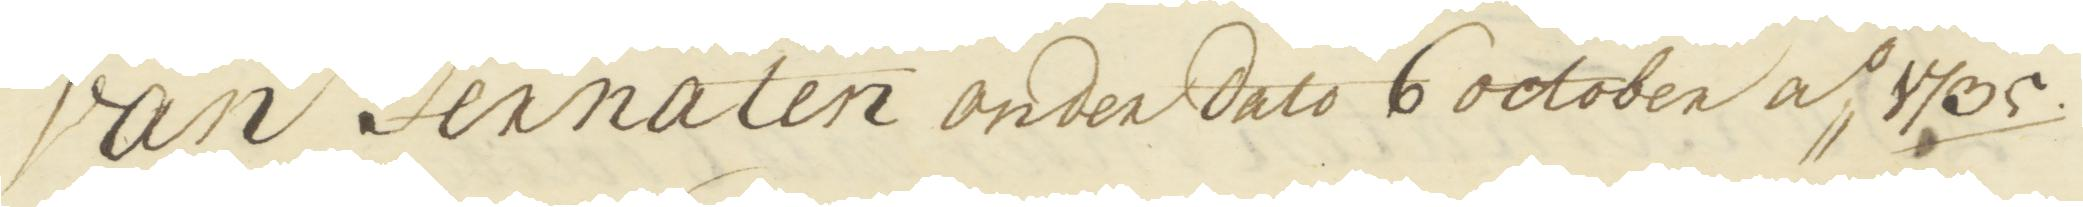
van Ternaten onder dato 6 october a„o 1735.
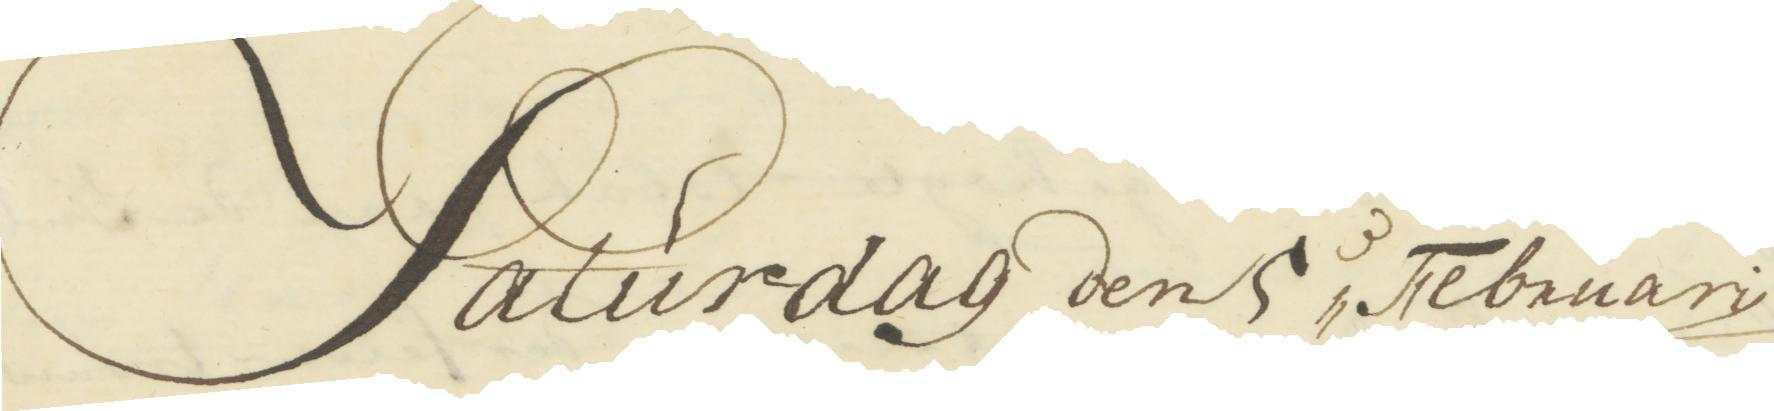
Saturdag den 5„e Februarij
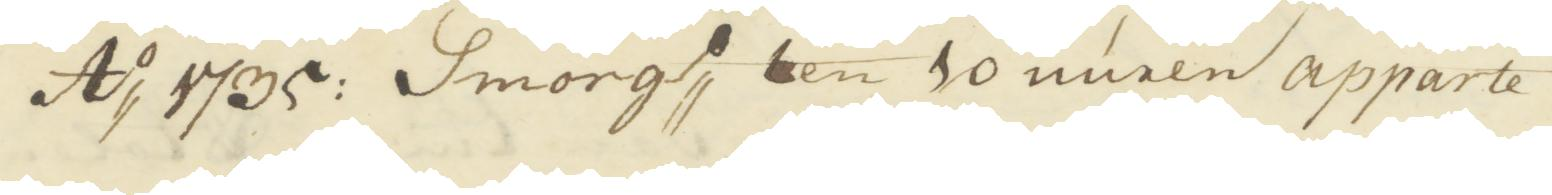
A„o 1735: smorg„s ten 10 uuren apparte
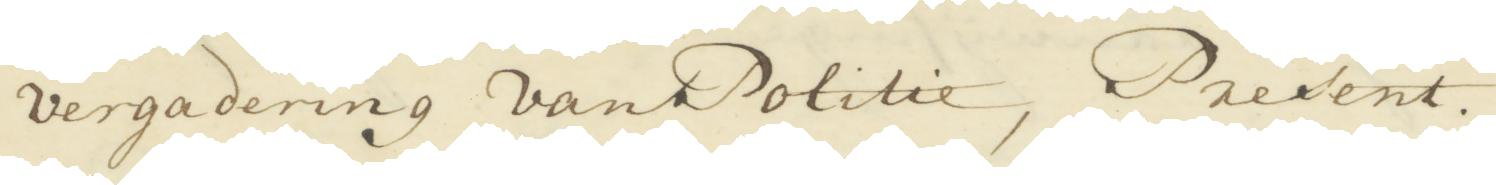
vergadering van Politie, Present.
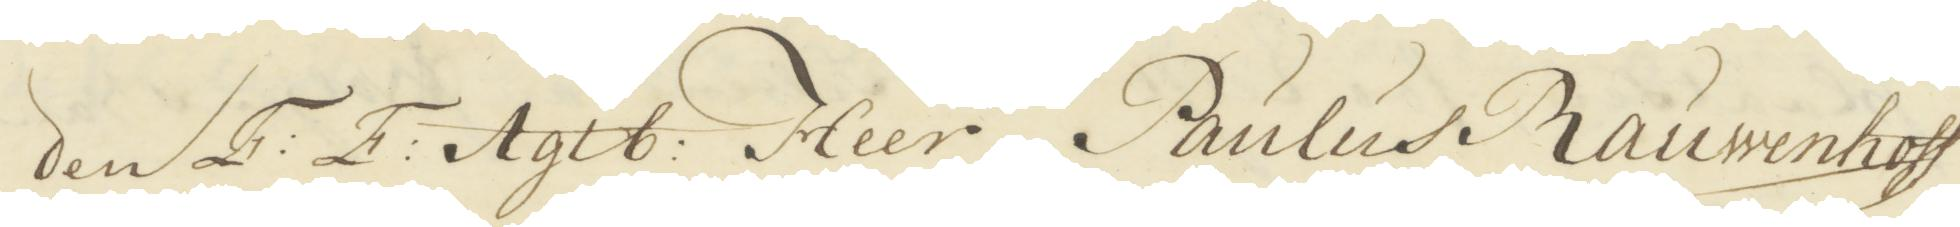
den E: E: Agtb: Heer, Paulus Rauwenhoff
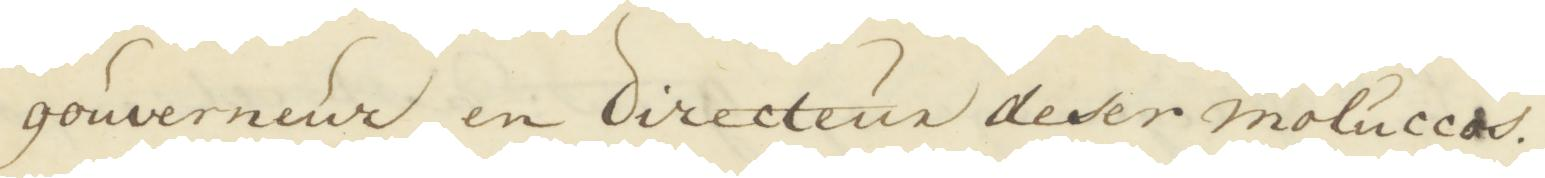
gouverneur en directeur deser moluccas.
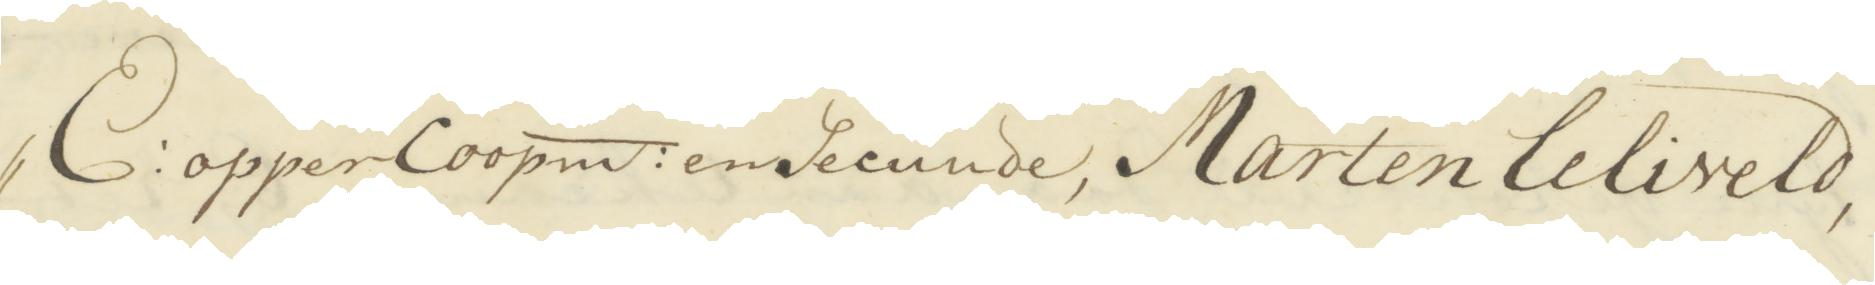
„ E: opper Coopm: en secunde, Marten leliveld,
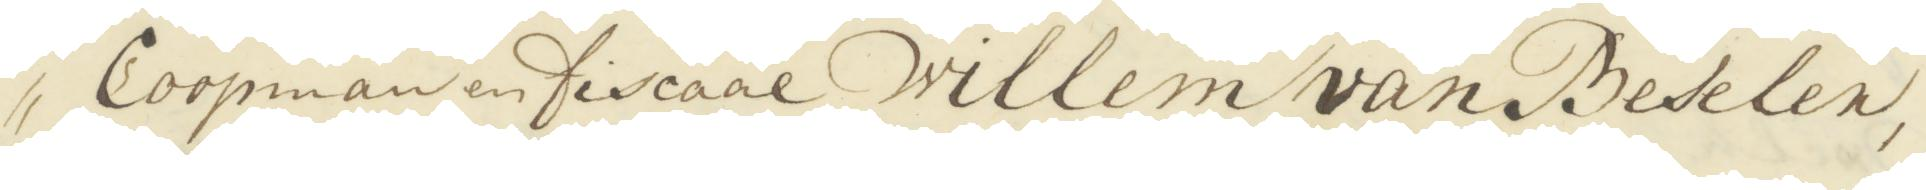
„ Coopman en fiscaal Willem van Beseler,
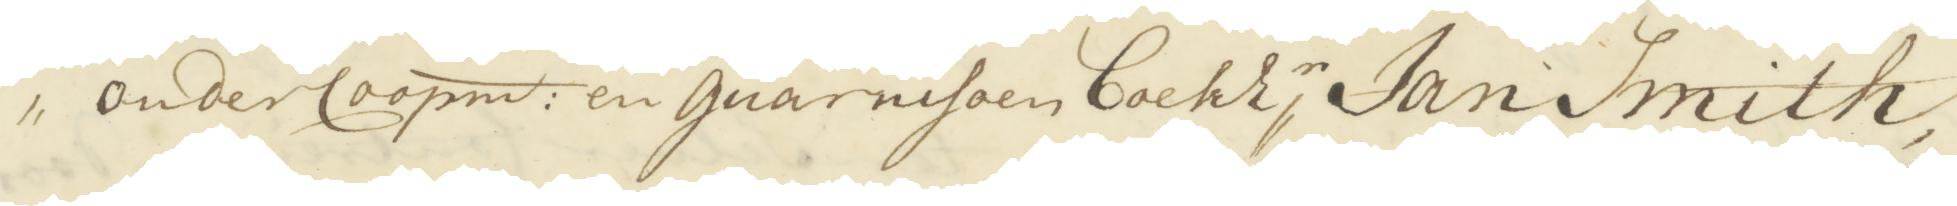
„ onder Coopm: en guarnisoen boekh„r Ian Smith,
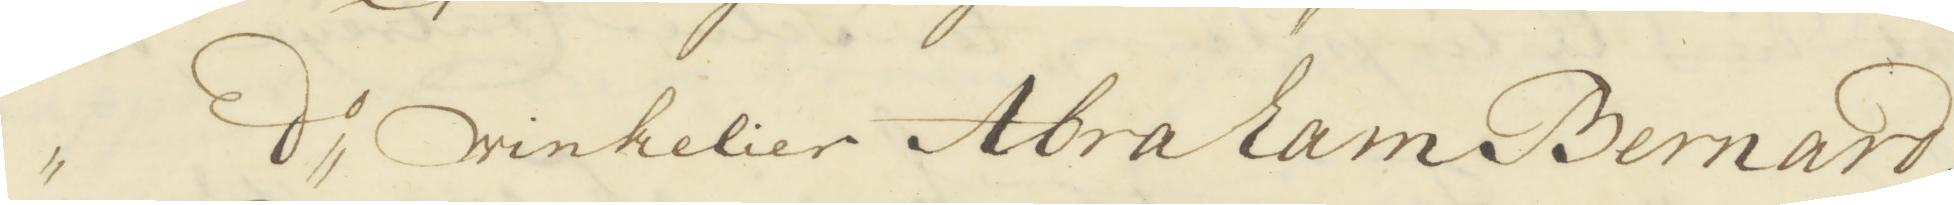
„ d„o winkelier Abraham Bernard,
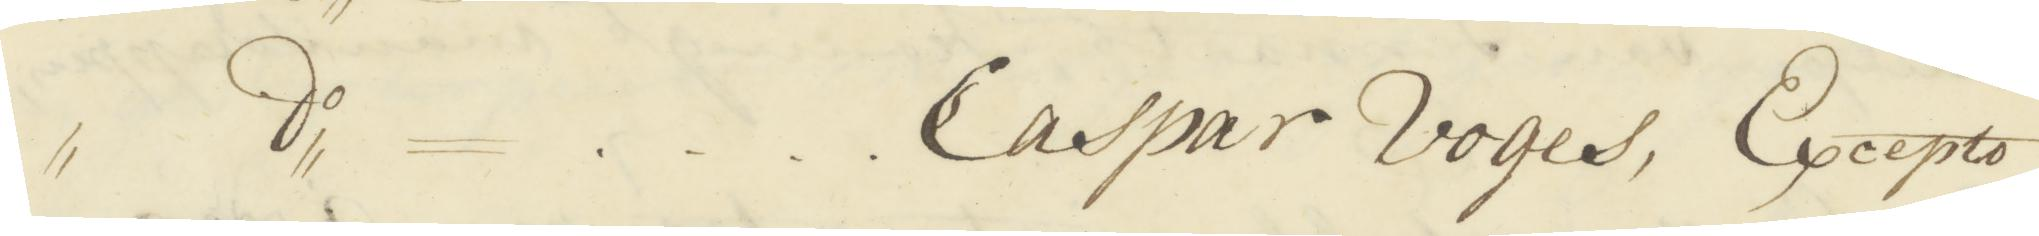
„ d„o = . . . . Caspar Voges, Excepto,
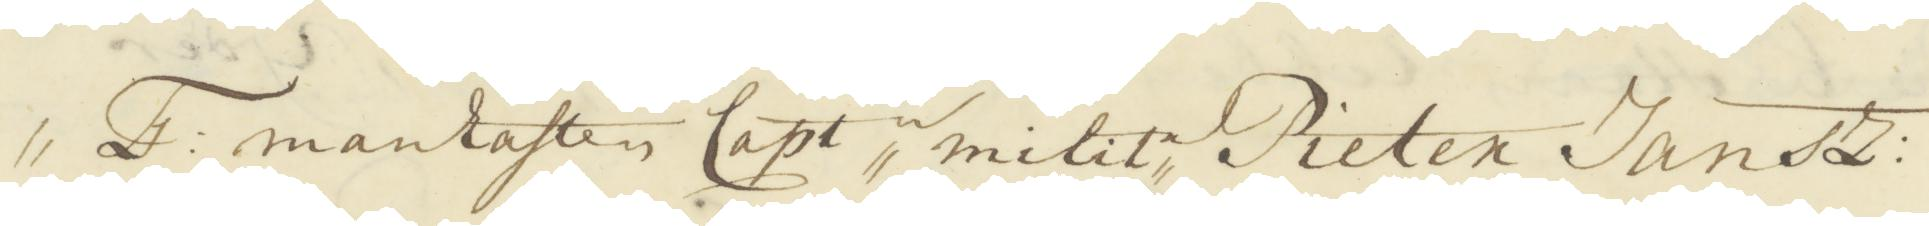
„ E: manhaften Capt„n milit„r Pieter Iansz:
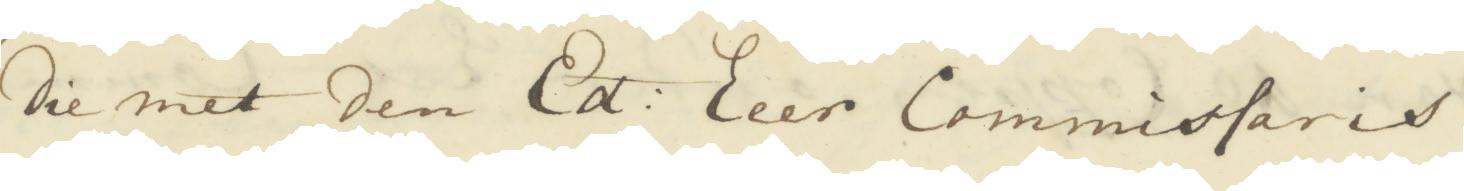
die met den Ed: heer Commissaris
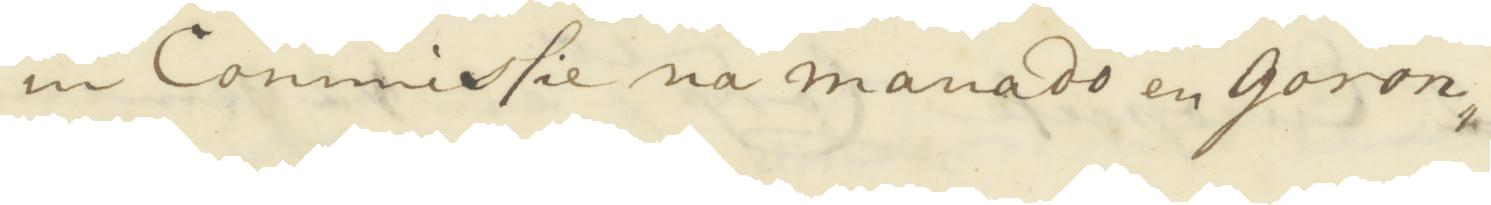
in Commissie na manado en goron„
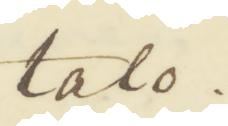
talo
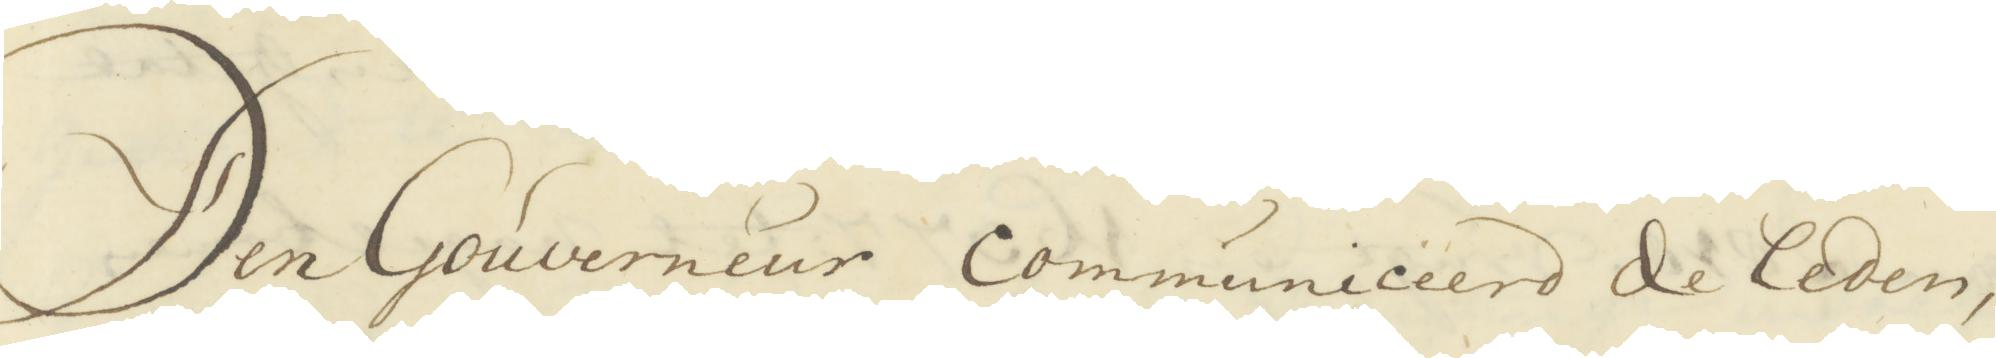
Den Gouverneur Communiceerd de leden,
